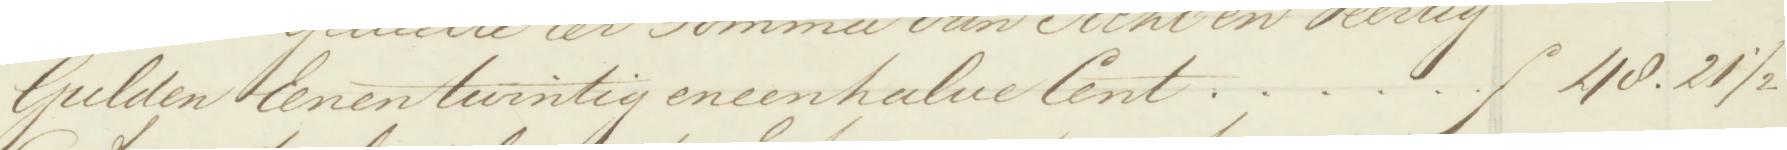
Gulden Eenen twintig en een halve Cent . . . . . . ƒ 48. 21½
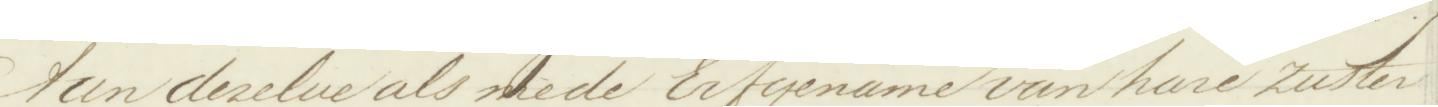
Aan dezelve als mede Erfgename van hare zuster
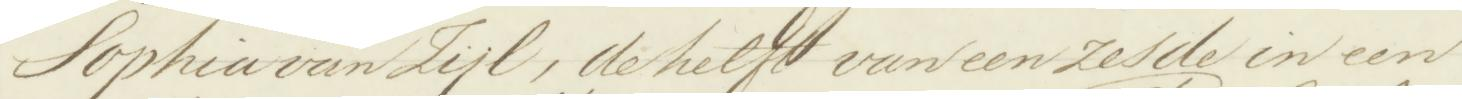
Sophia van Zijl, de helft van een zesde in een
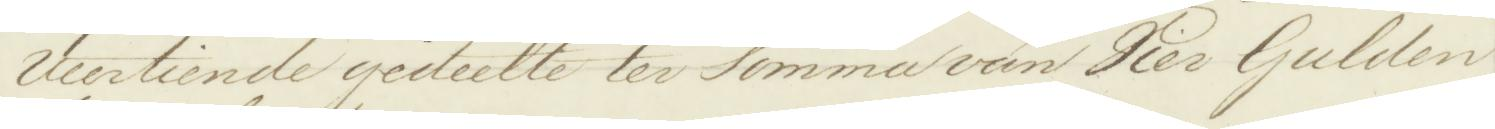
Veertiende gedeelte ter somma van Vier Gulden
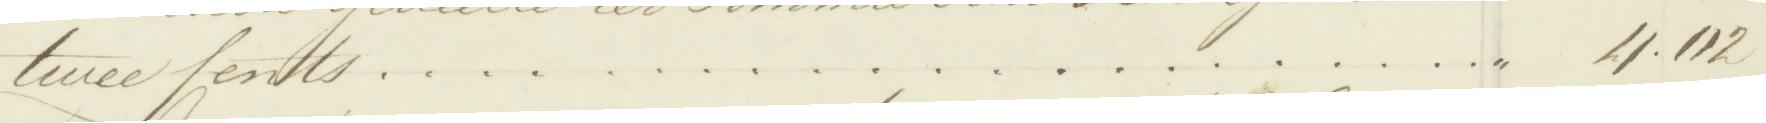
twee Cents . . . . . . . . . . . . . . . . . . . . . „ 4.02
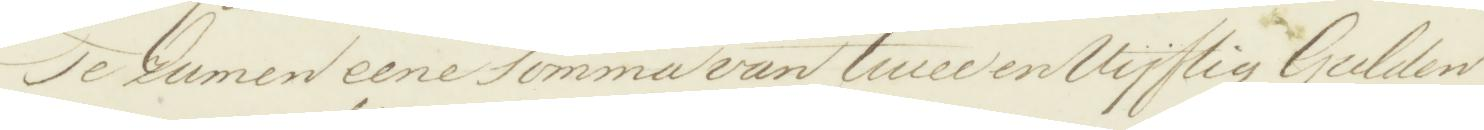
Te zamen eene somma van twee en Vijftig Gulden
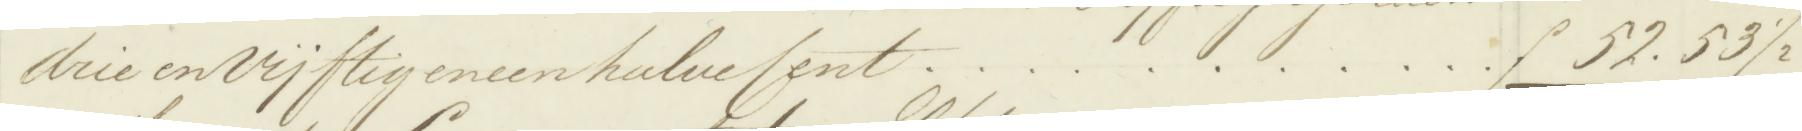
drie en Vijftig en een halve Cent. . . . . . . . . . . ƒ 52.53½
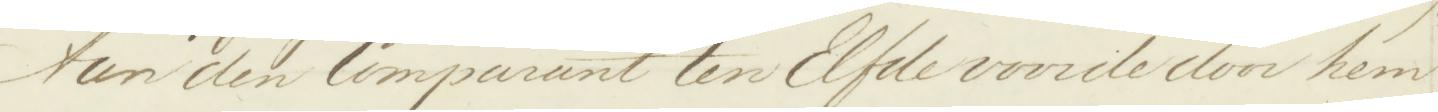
Aan den Comparant ten Elfde voorde door hem
